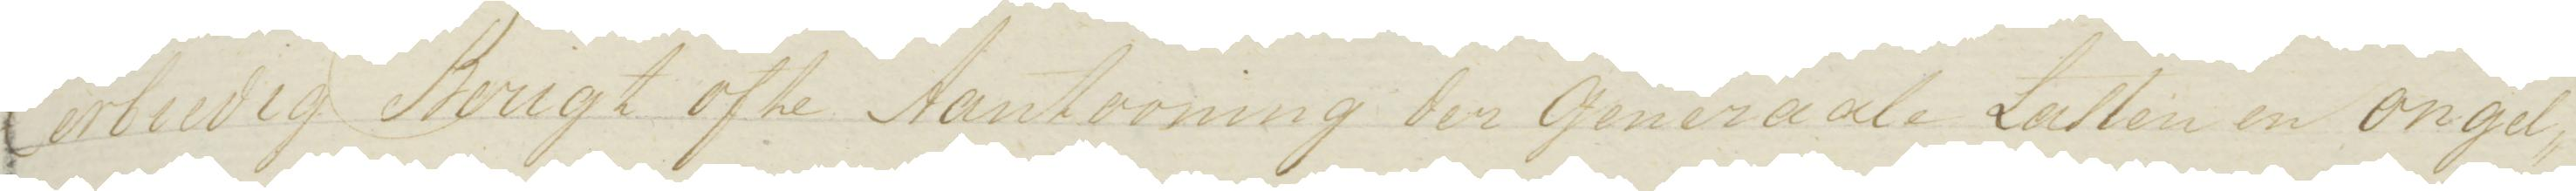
Eerbiedig Berigt of te Aantooning der generaale Lasten en ongel„
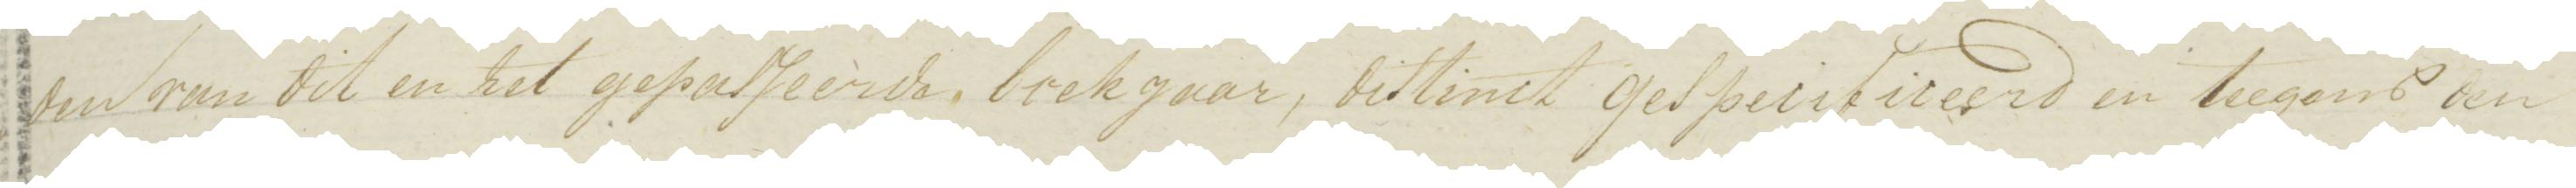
„den van dit en het gepasseerde boekjaar, distinct gespecificeerd en teegens den
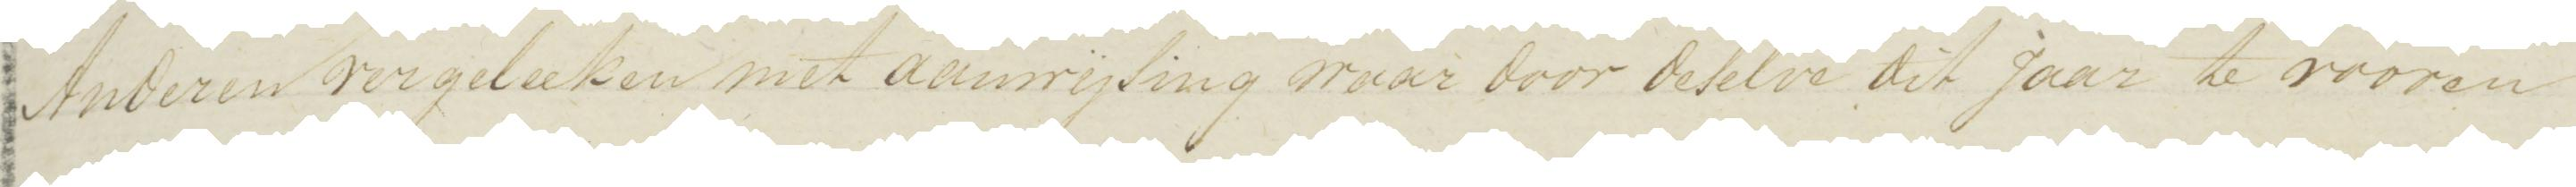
Anderen vergeleeken met aanwijsing waar door deselve dit jaar te vooren
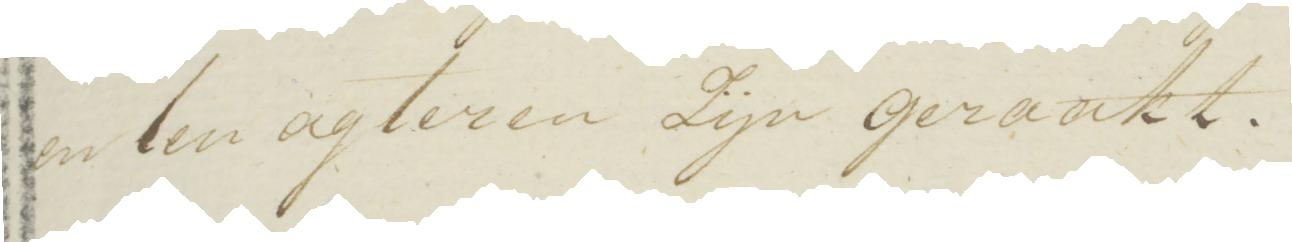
en ten agteren Zijn geraakt.
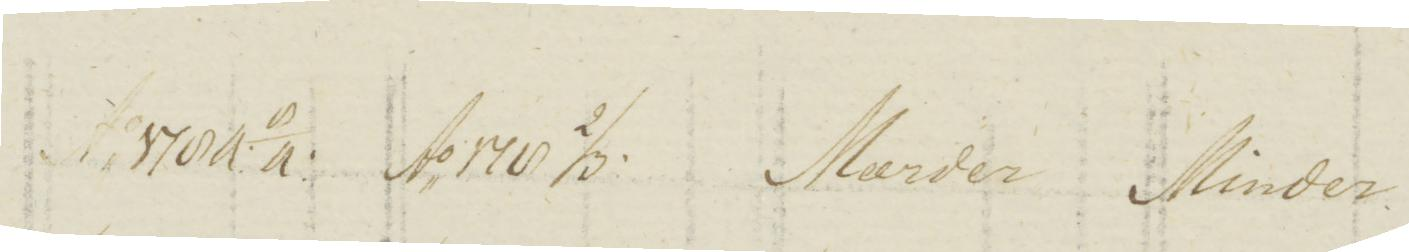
A„o 1784: 8/4: A:o 178 2/3: Meerder Minder
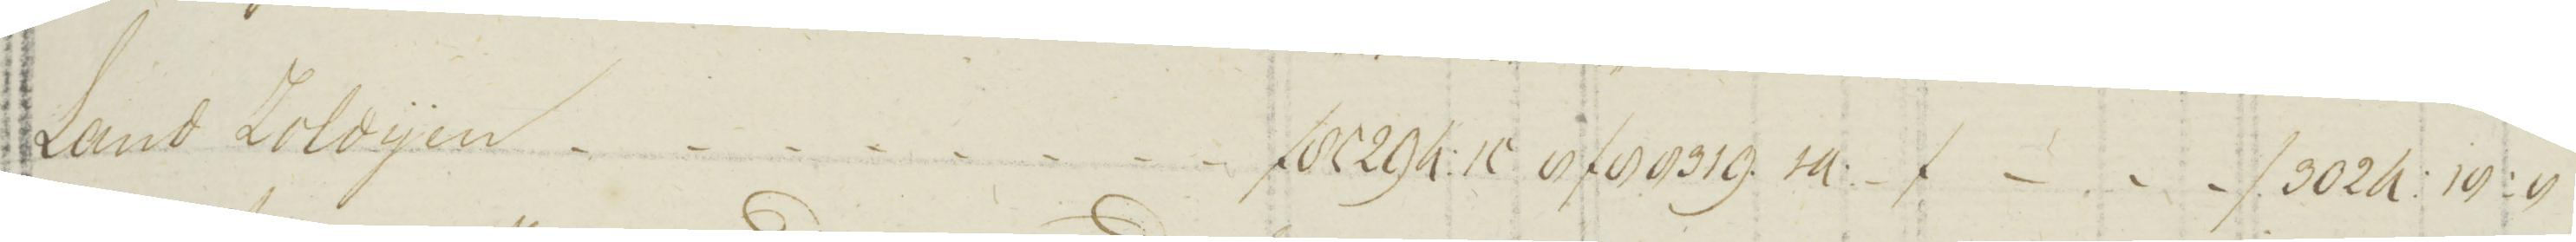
Land Zoldijen- - - - - - - - ƒ85294:15:8 ƒ889319:14:—ƒ—.- - ƒ3024:18:8
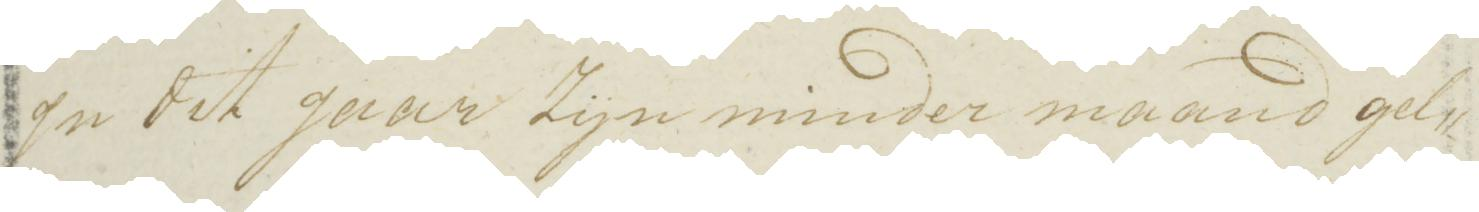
Jn dit jaar Zijn minder maand gel„
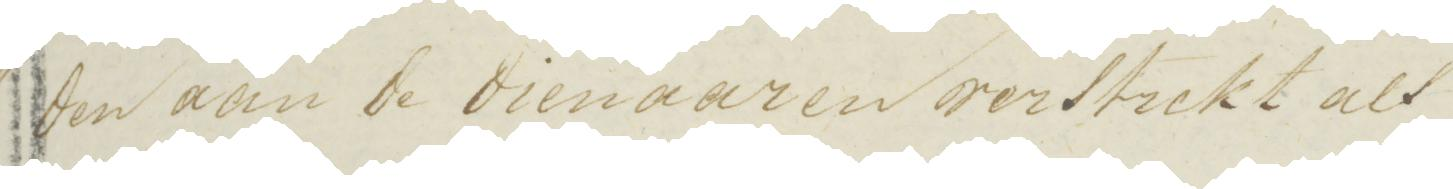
den aan de dienaaren verstrekt als
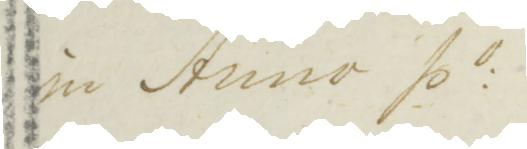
in Anno p:o
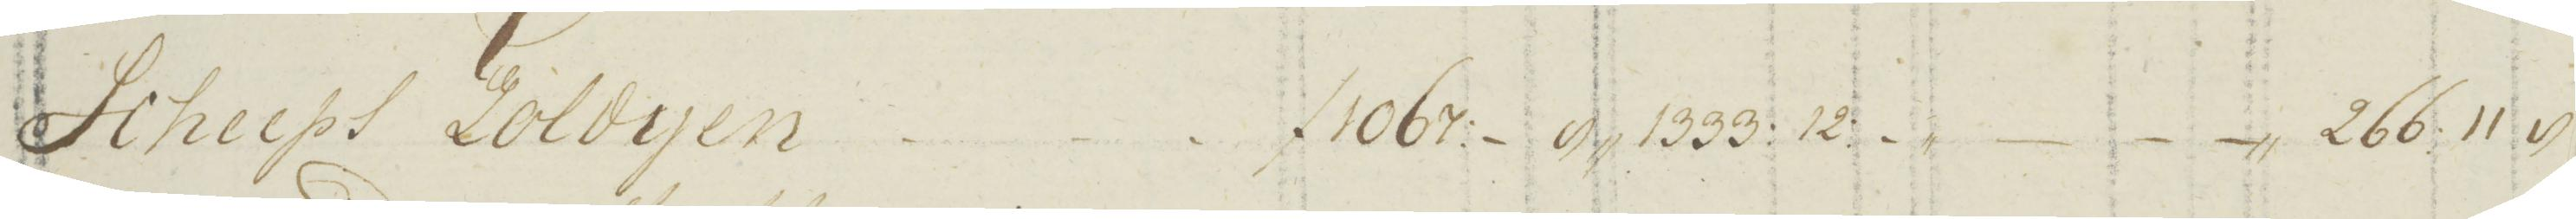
Scheeps Zoldyen - - - ƒ1067:—:8„ 1333:12:—„ „266:11:8
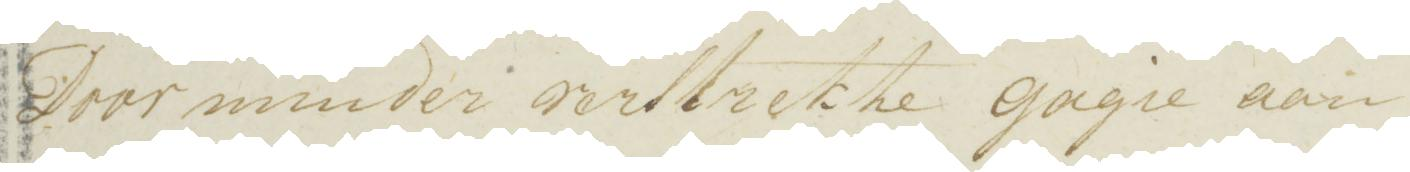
Door minder verstrekte gagie aan
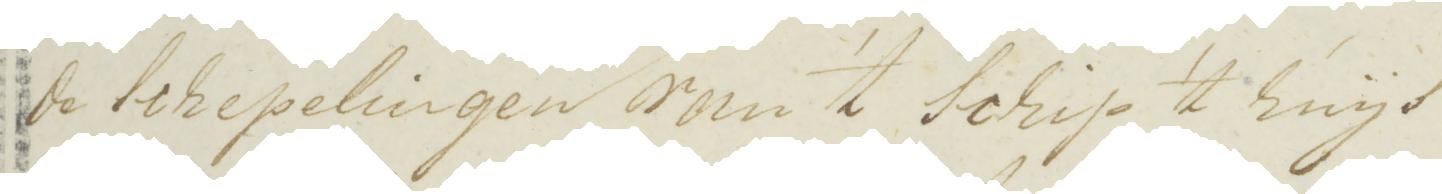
de schepelingen van ’t schip ’t huijs
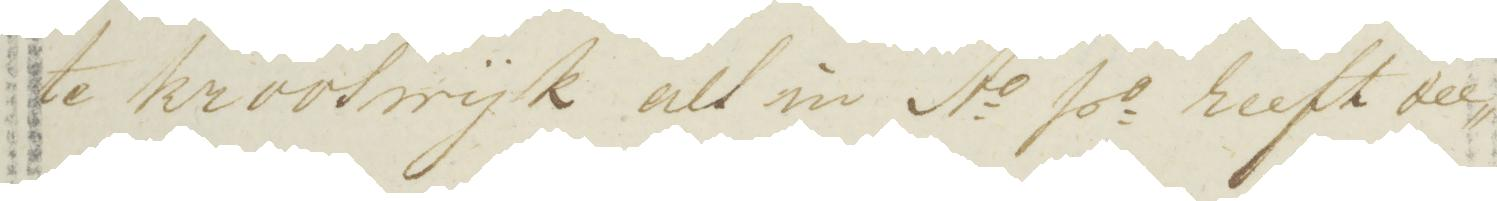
te krooswijk als in A:o p:o heeft dee„
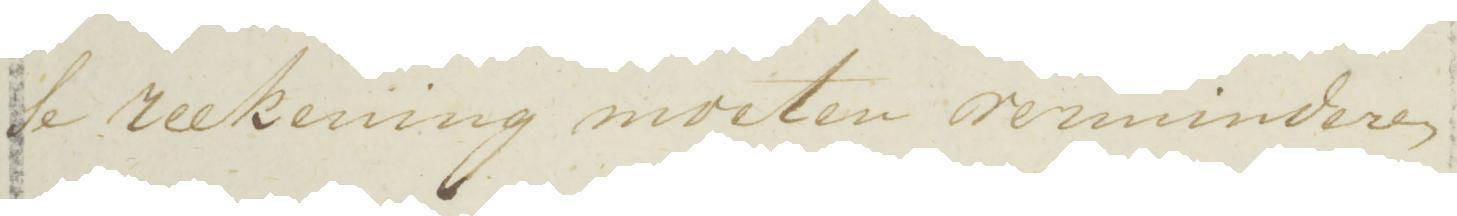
se reekening moeten verminderen
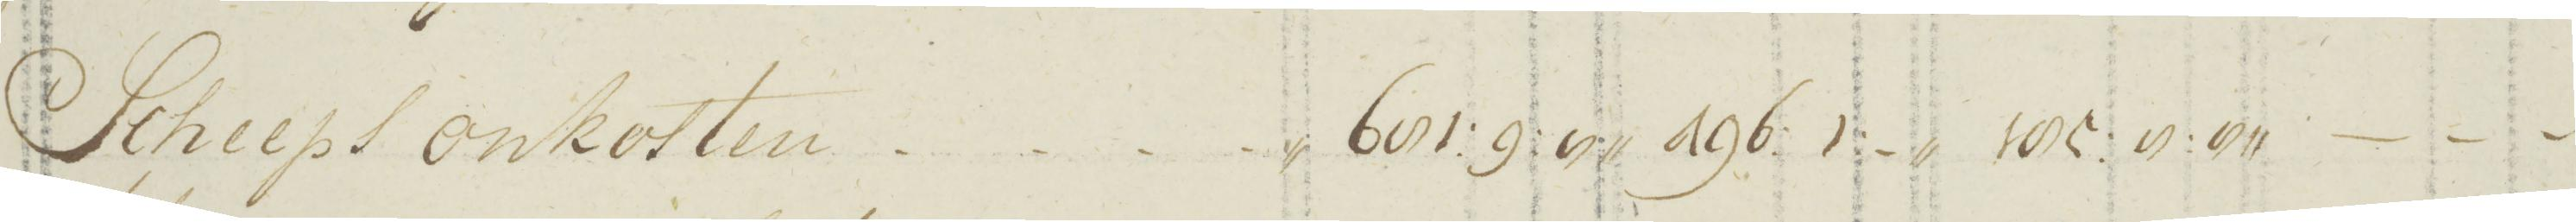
Scheeps onkosten - - - - „ 681:9:8„ 496:1:- „ 185:8:8„ — — —
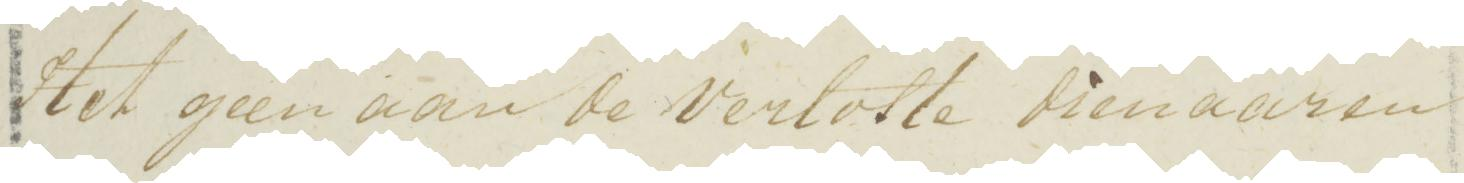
Het geen aan de verloste dienaaren
